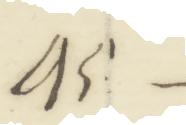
45:-:
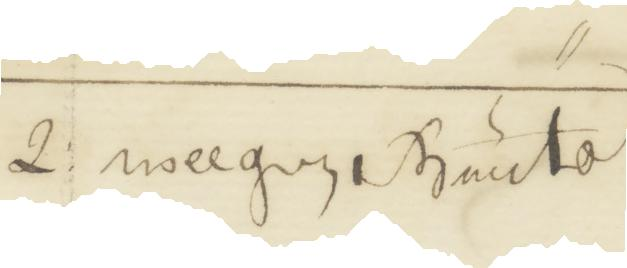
2: weegen 1 Bruto
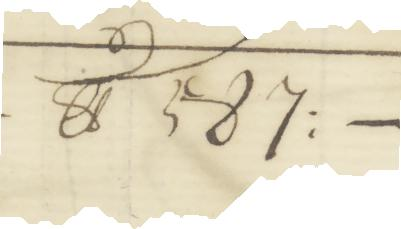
. - - lb 587:-:
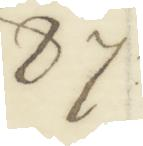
87: —
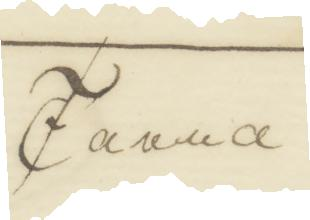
Tarra . . -
